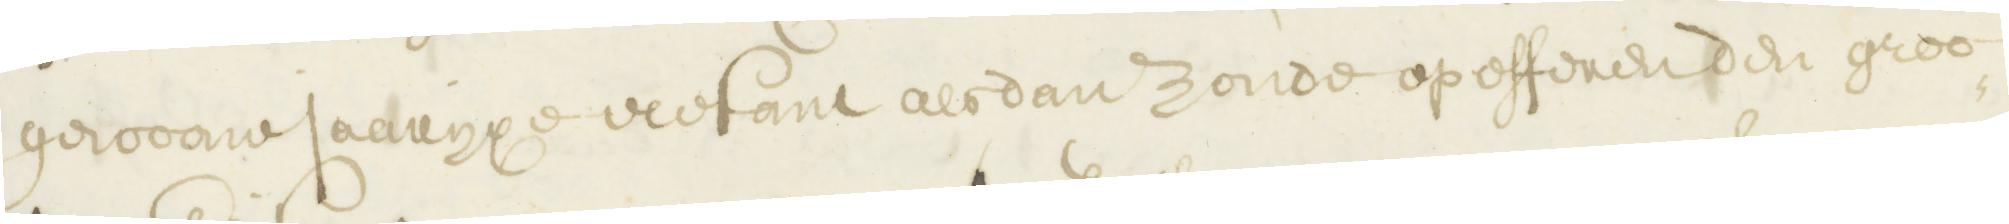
gewoone Jaarlijxe elefant als dan zoude op offeren den groo„
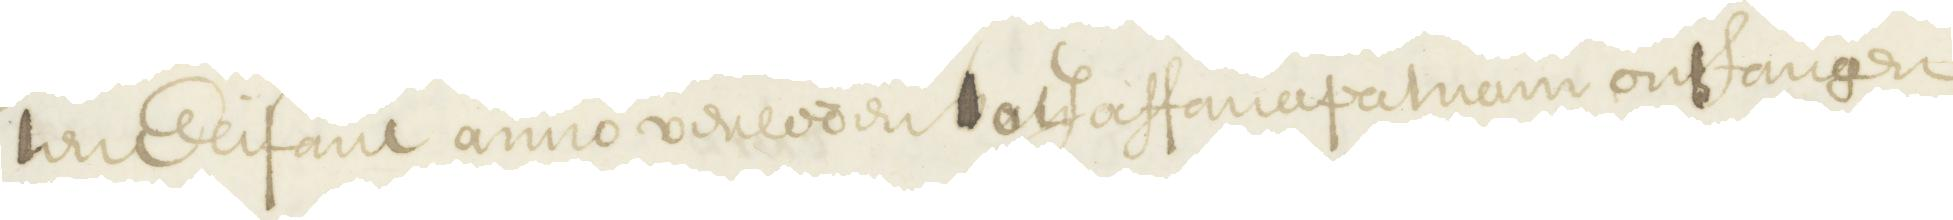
ten Elifant anno verleden tot Jaffanapatnam ontfangen
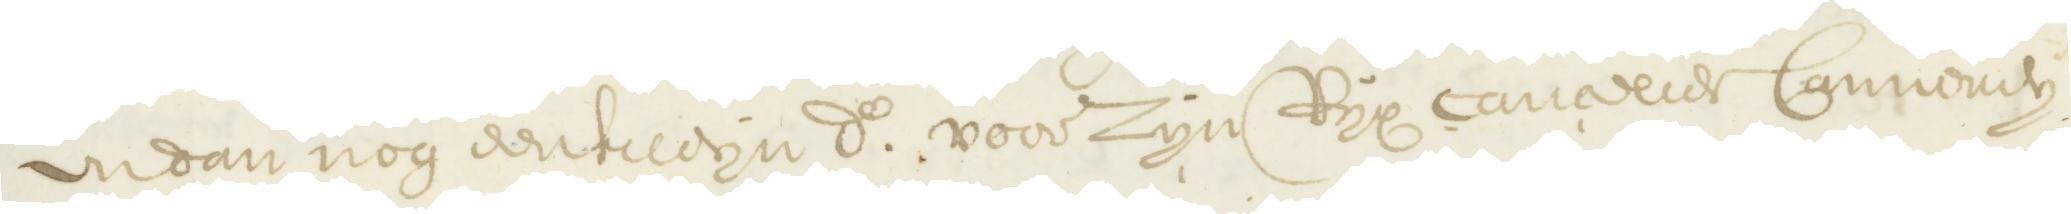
en dan nog een kleijn d.o voor zijn Rijx cancelier Cannerey
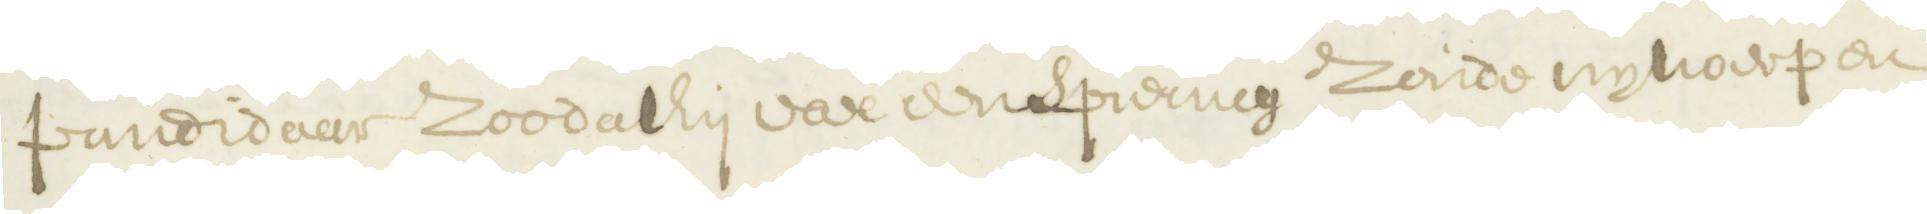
pandi daar zoo dat hij wel een spiering zoude uytwerpen
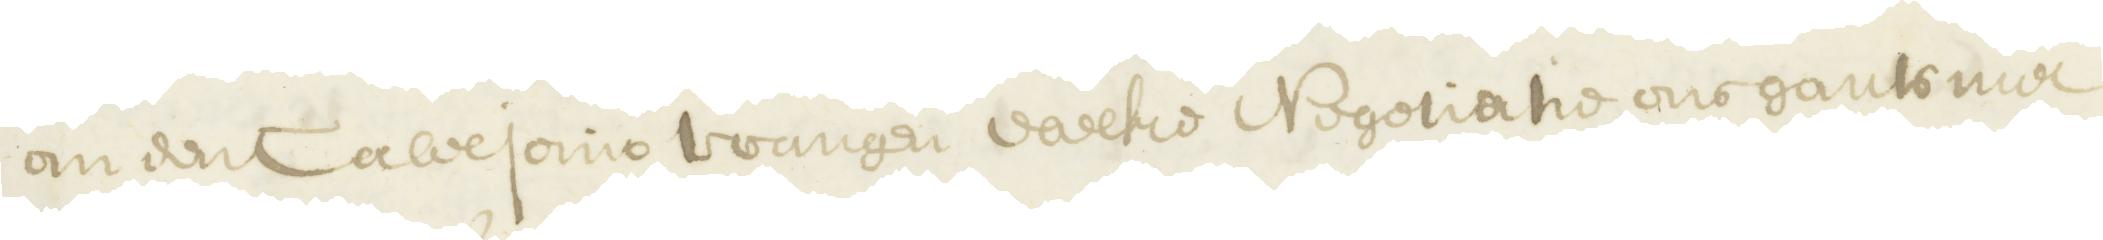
om een Cabeljouw tevangen welke Negotiatie ons gants niet
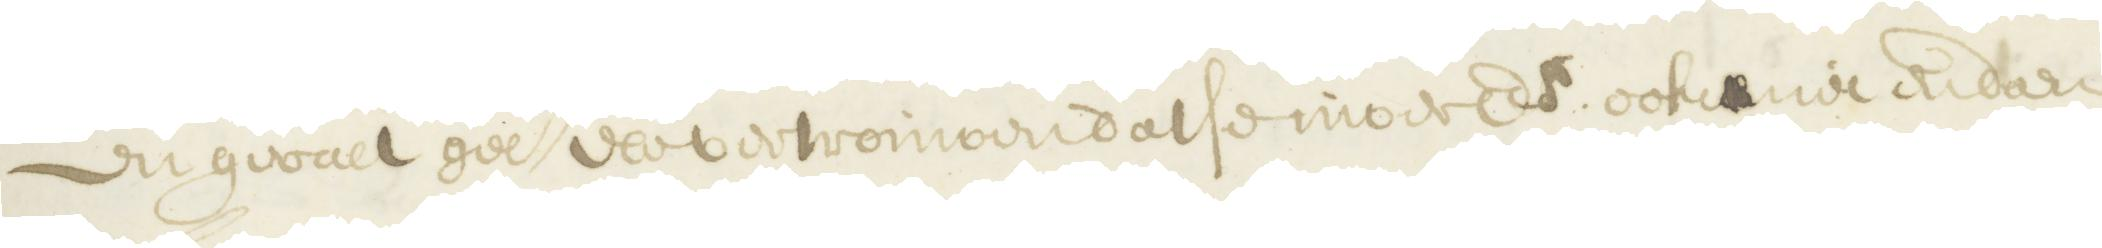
en gevalt gelijk we vertrouwen datse uwer Ed. ook niet en doen
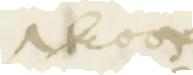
^koop
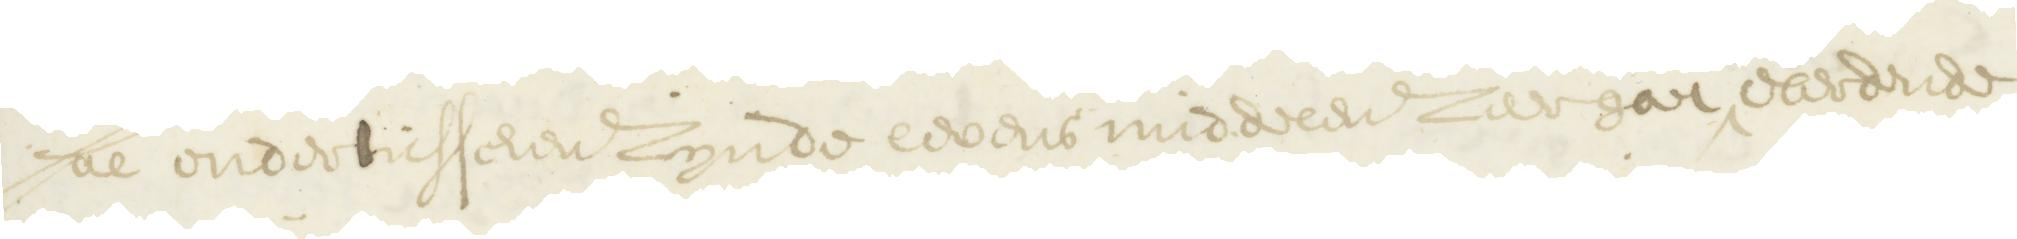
sal ondertusschen zijn de levens middelen zeer goet ^ werdende
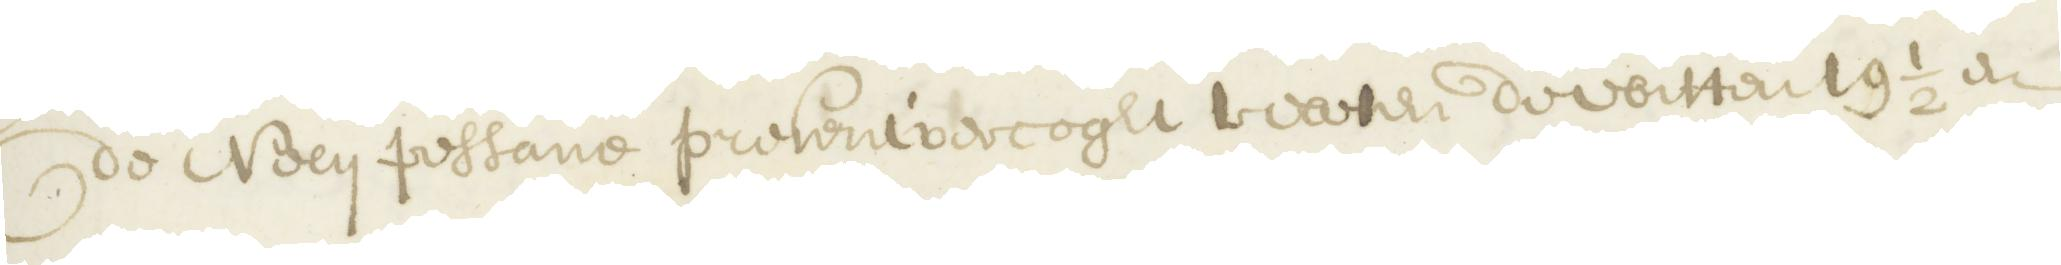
de Nelij pessane present vercoght te weten de witten 19½ en
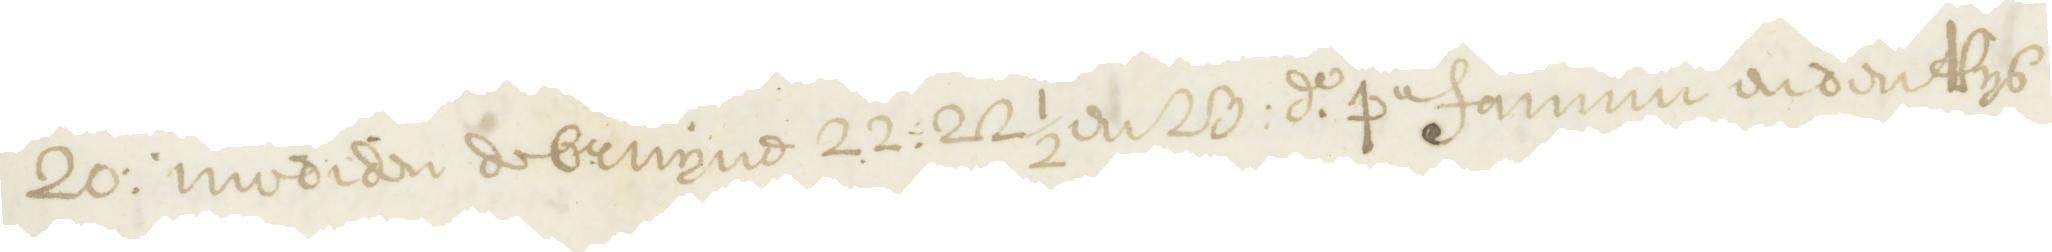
20: mediden de bruijne 22: 22½ en 23: d.o pr fanum en den Rijs
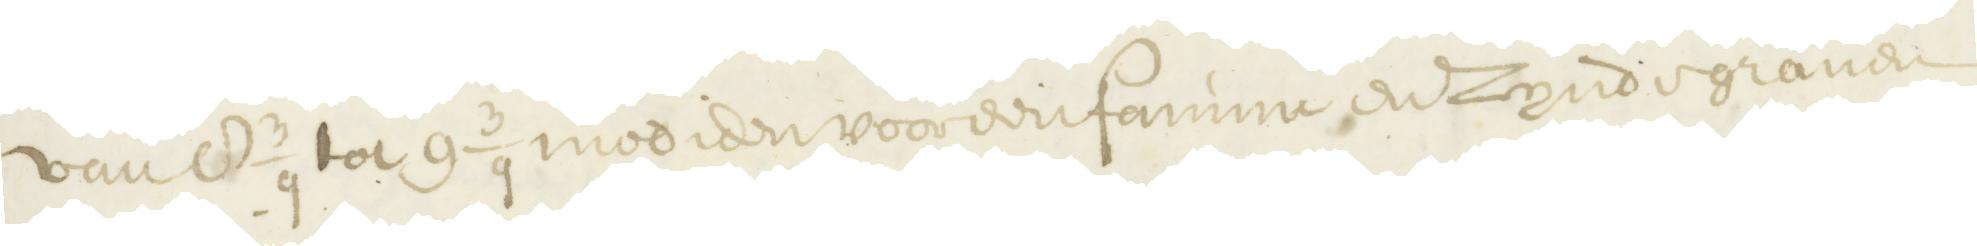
van 8 3/9 tot 9 3/9 mediden voor een fanum en zijn de granen
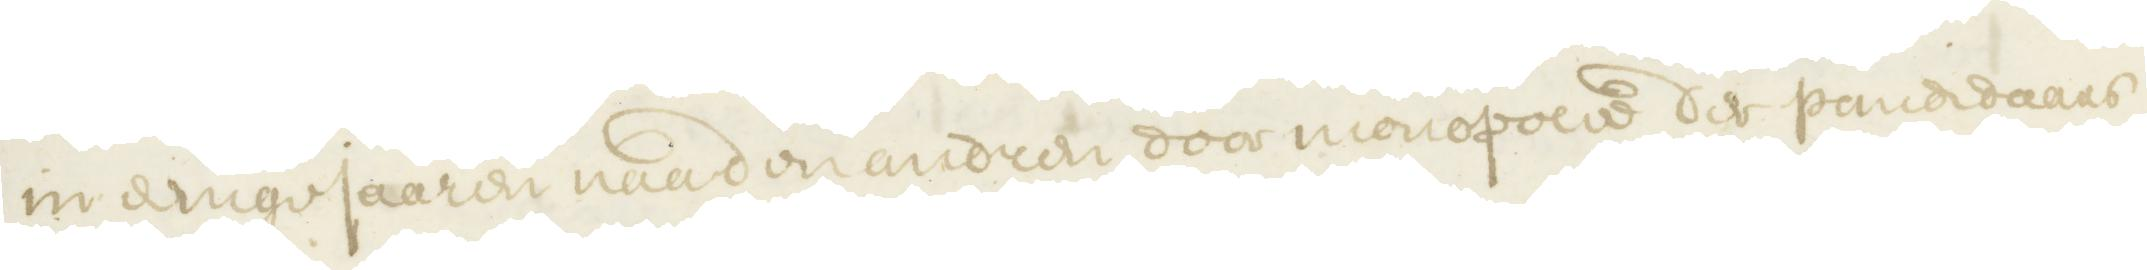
in eenige jaaren naa den andren door monopolie der pandidaars
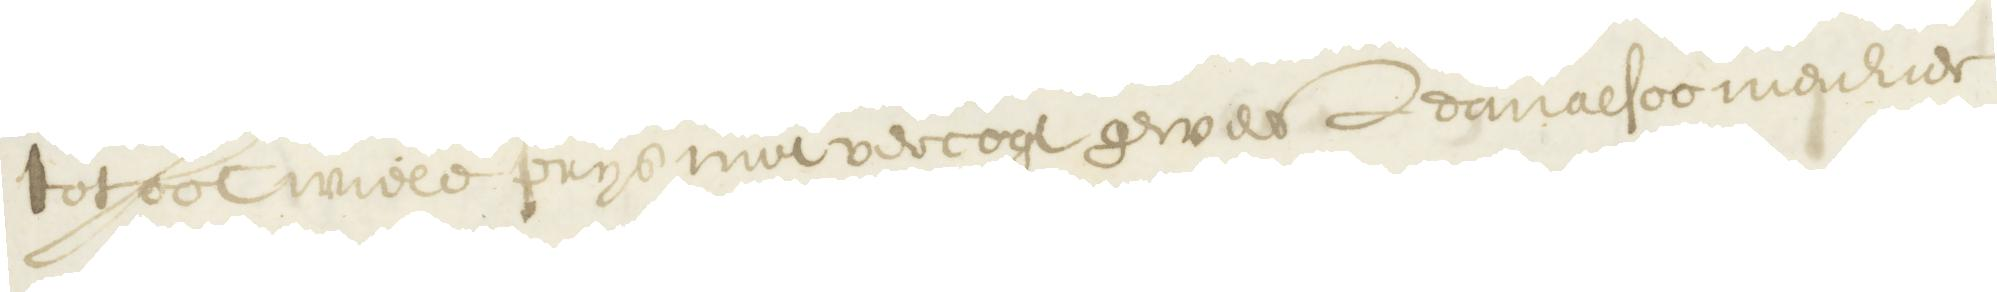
tot soo civiele prijs niet vercogt geweest dan alsoo men hier
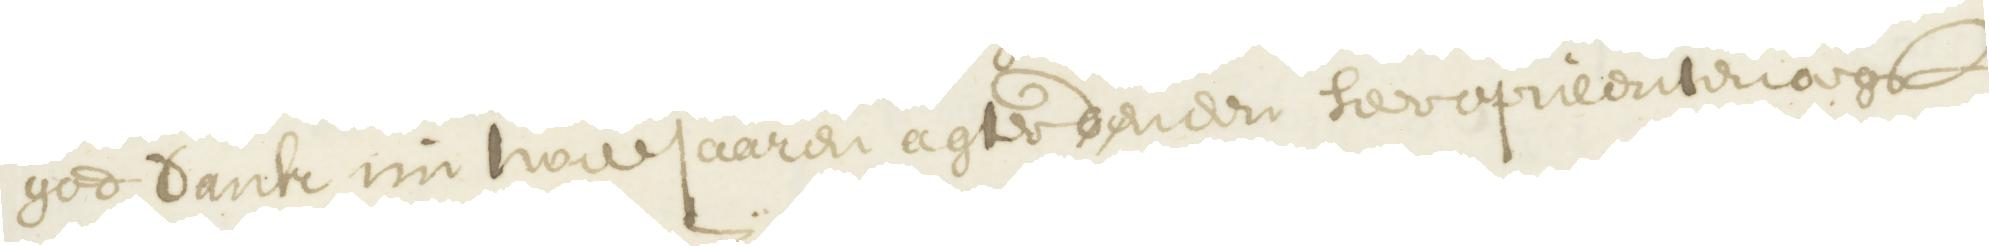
god dank nu twee jaaren agter den een seer opulenten oogst
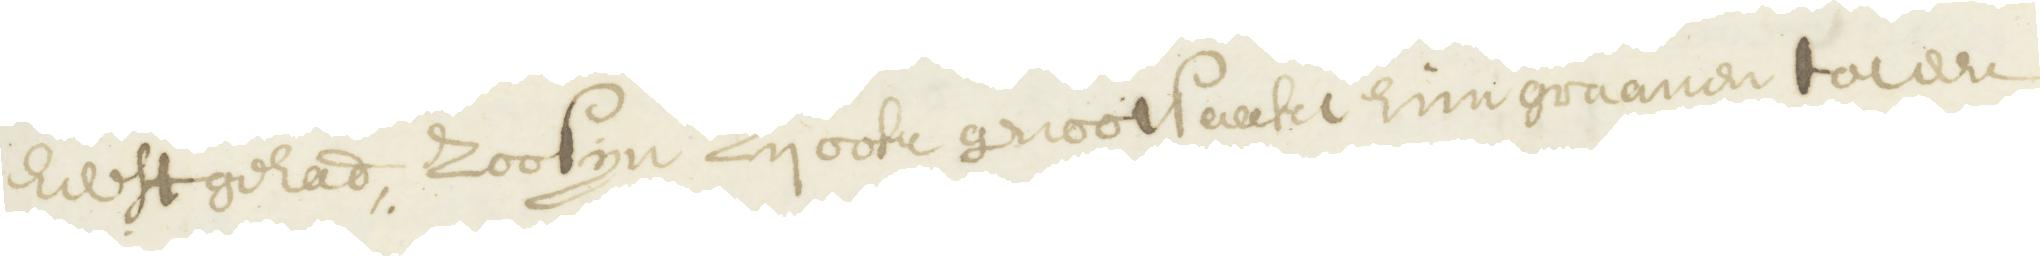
heeft gehad, zoo sijn zij ook genootsaakt hun graanen tot een
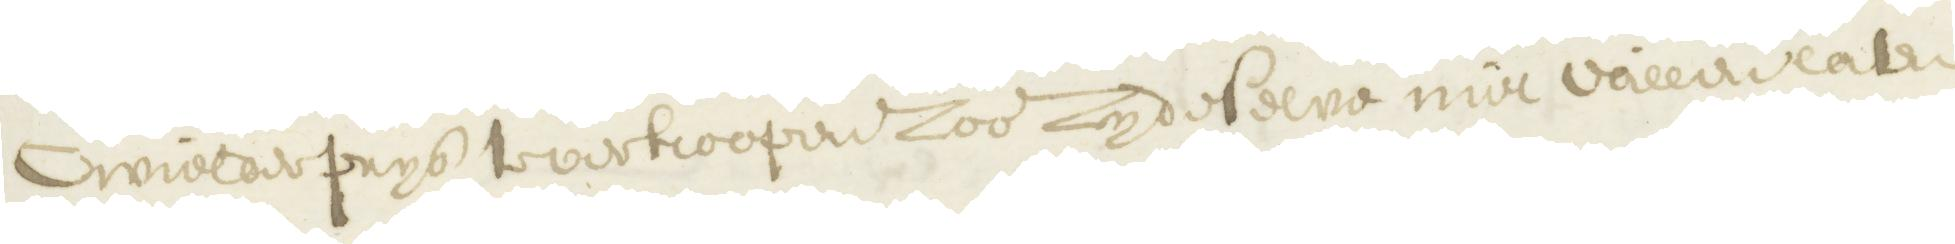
Civielder prijs te verkoopen zoo zy deselve niet willen laten
